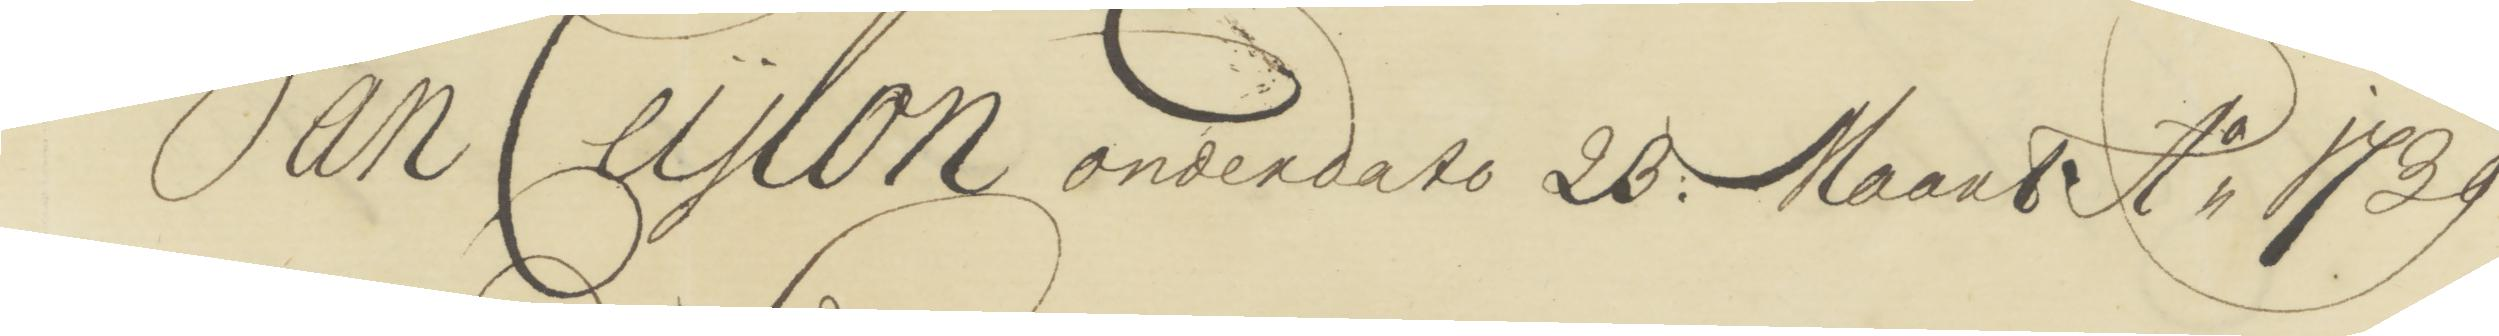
Van Ceijlon onderdato 23: Maart A„o 1739
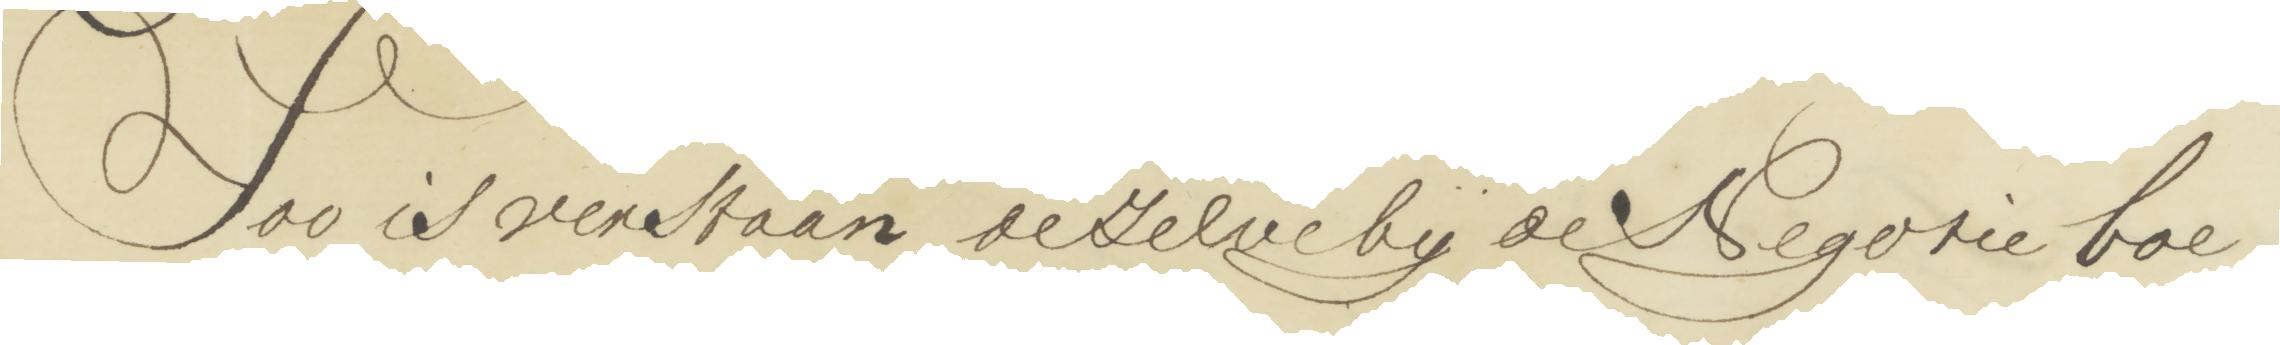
Soo is verstaan dezelve bij de Negotie boe
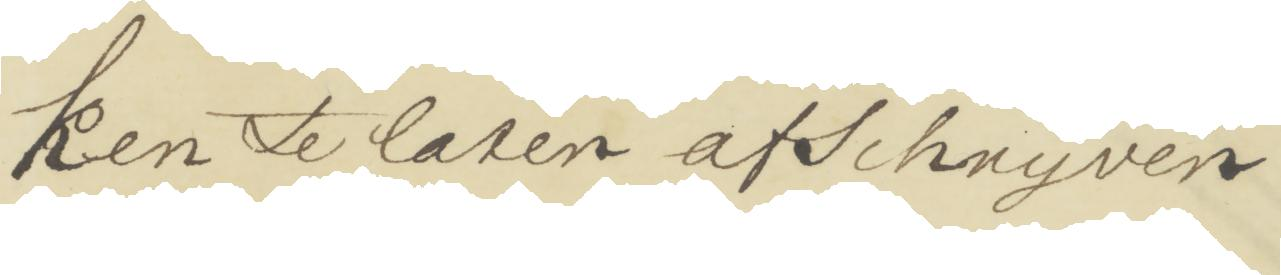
ken te laten afschrijven
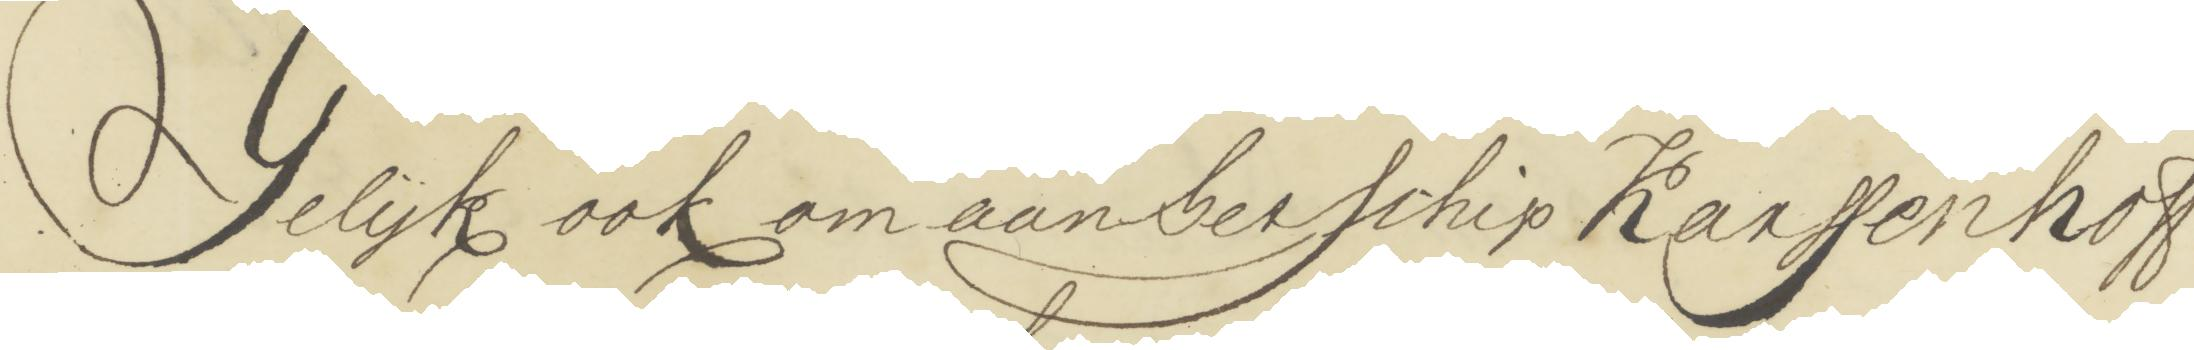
Gelijk ook om aan het Schip Karssenhoff
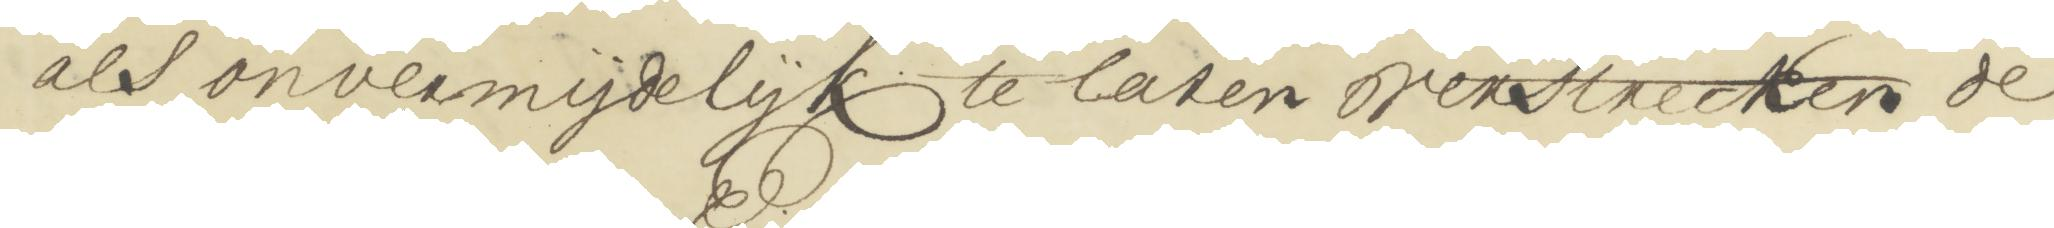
als onvermijdelijk te laten verstrecken de
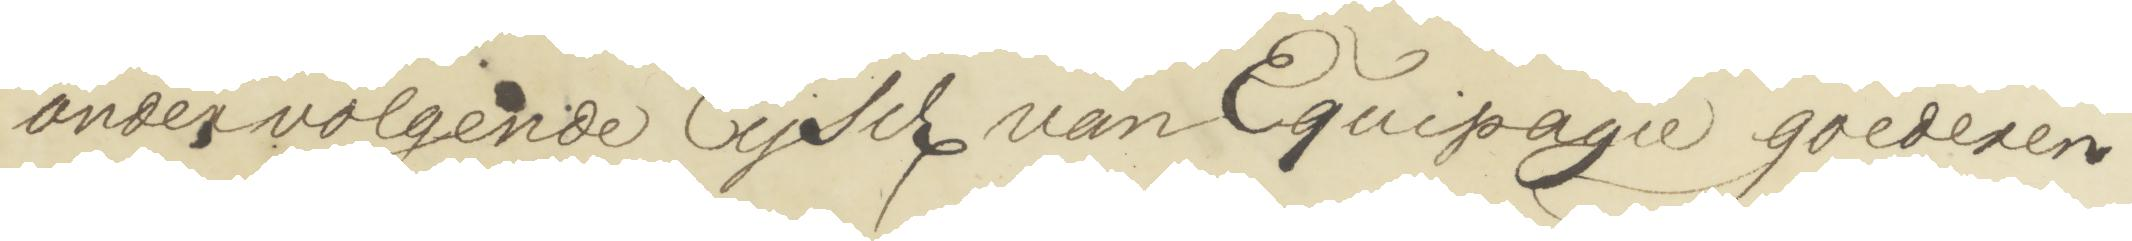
onder volgende Eijsch van Equipagie goederen
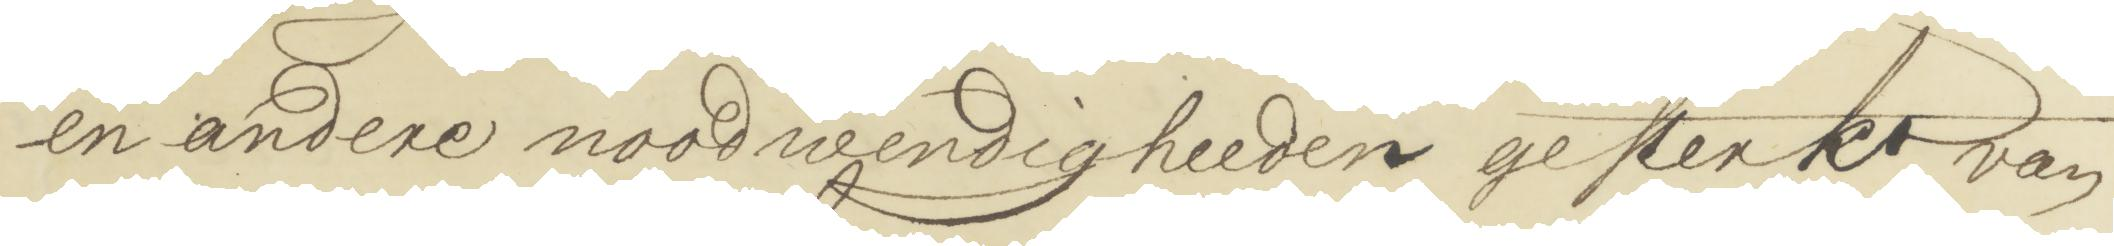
en andere noodwendigheeden gesterkt van
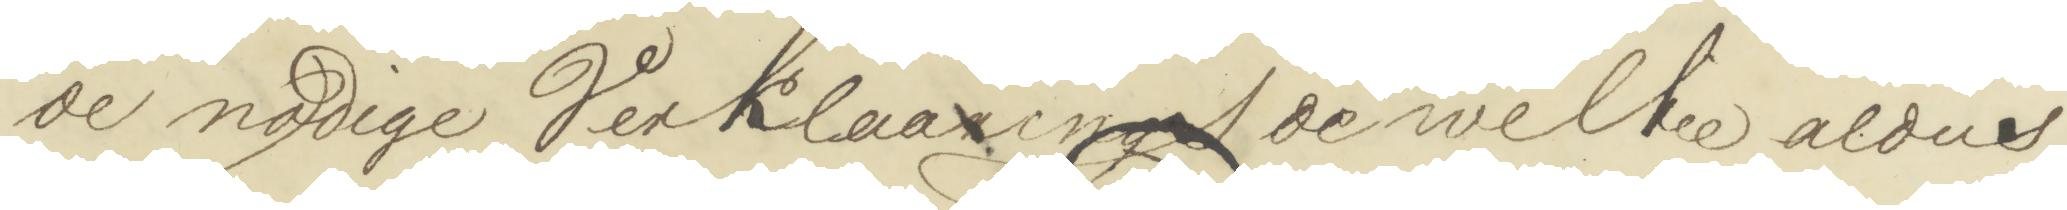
de nodige Verklaarings de welke aldus
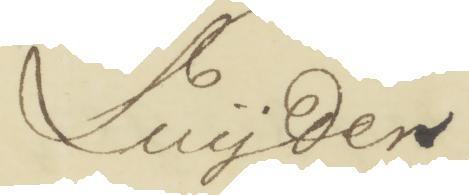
Luijden
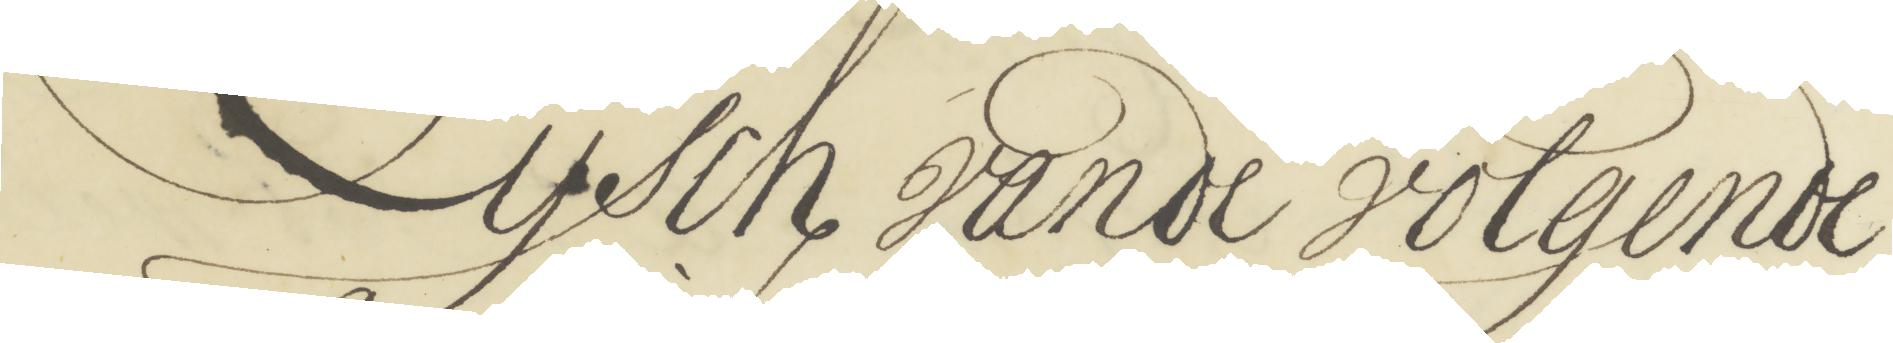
Eijsch vande volgende
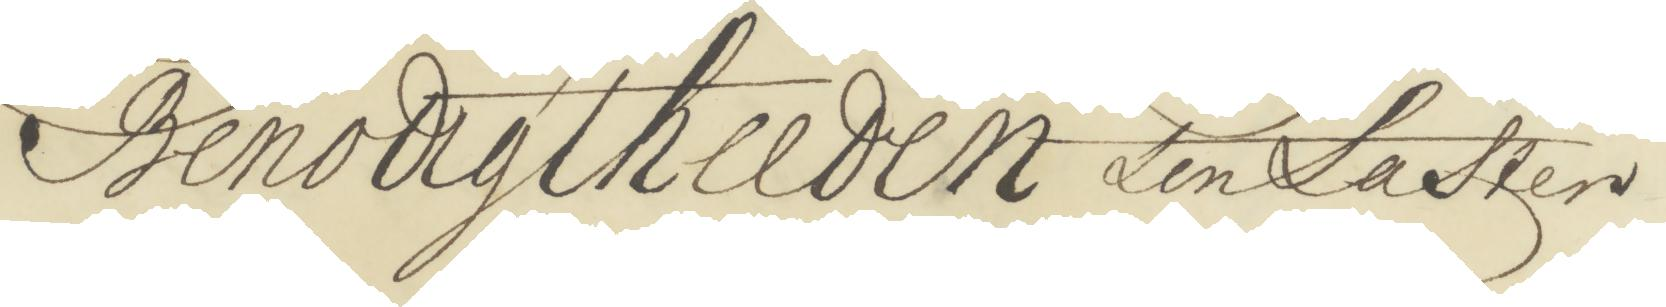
Benodigtheeden ten Lasten
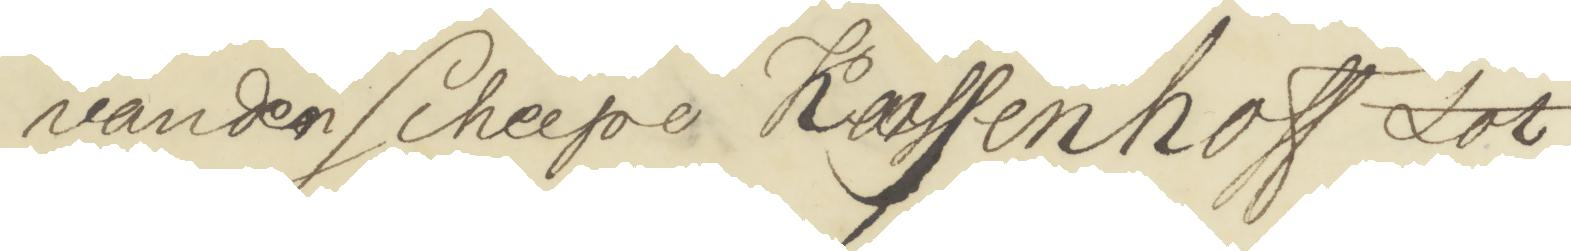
vanden scheepe Karssenhoff tot
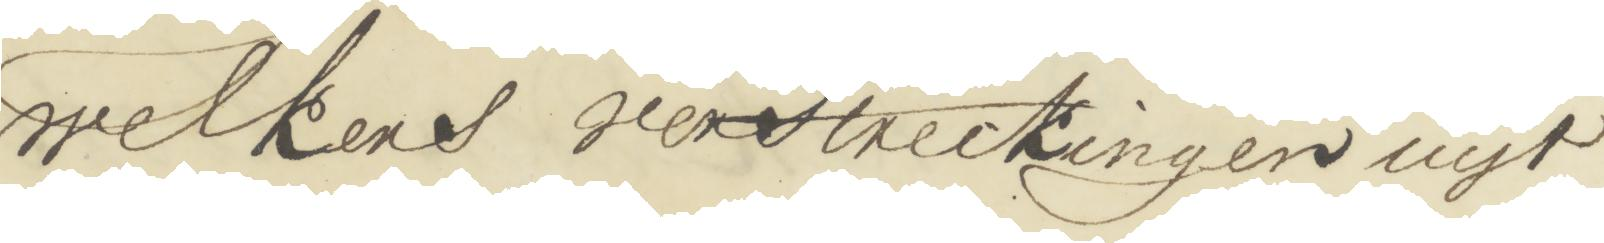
welkers verstreckingen uijt
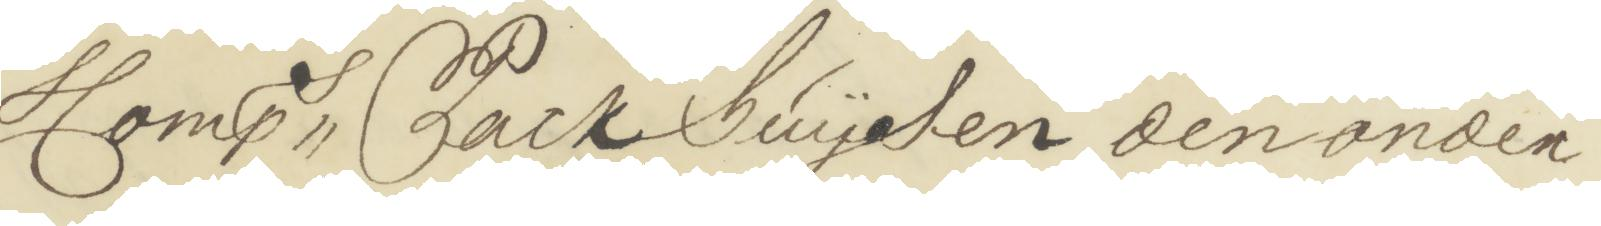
'sComp„s Packhuijsen den onder
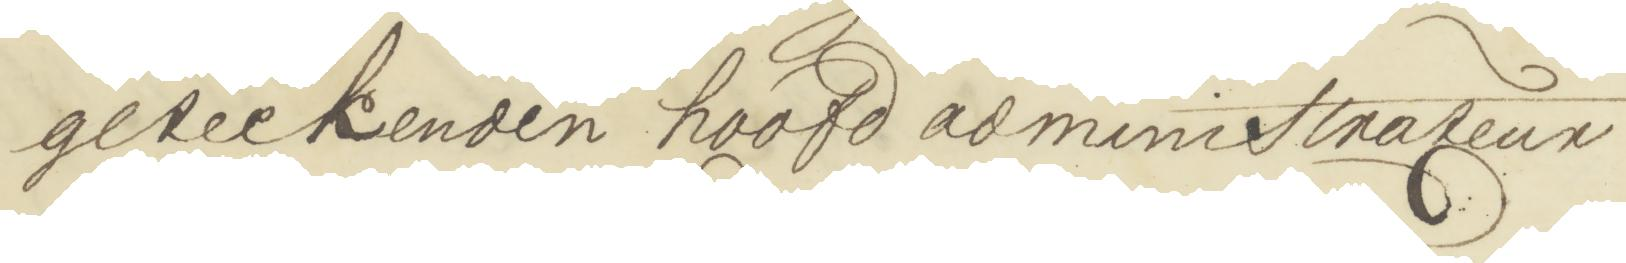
geteekenden hoofd administrateur
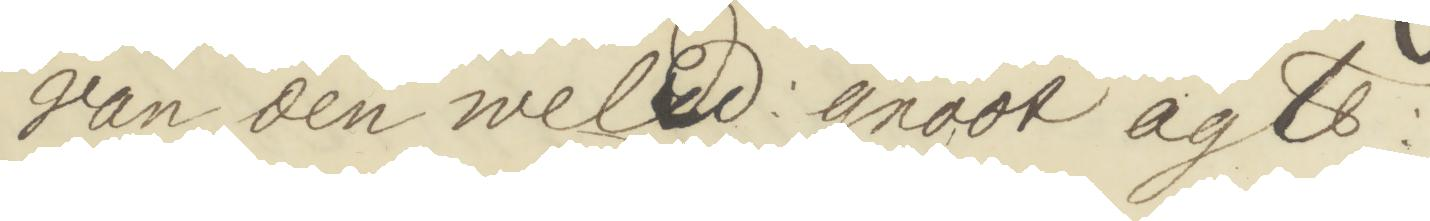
van den wel Ed: groot agtb:
